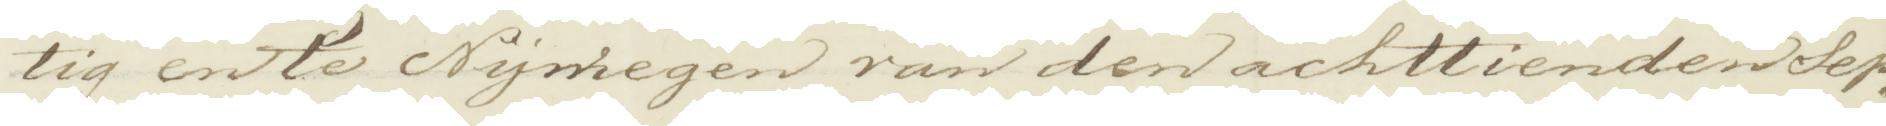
tig en te Nijmegen van den achttienden sep
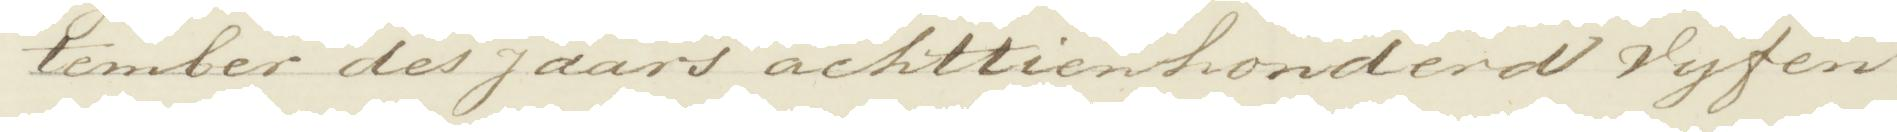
tember des jaars achttienhonderd Vyfen
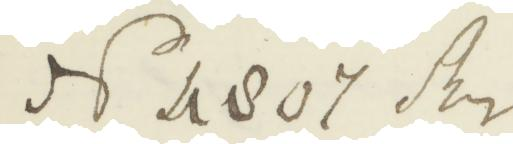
N 4807 Reg
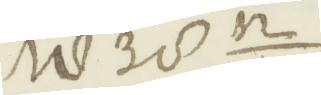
1838„12/
